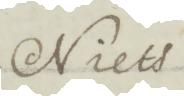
Niets
